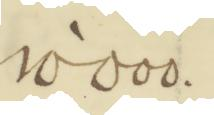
10'000.
